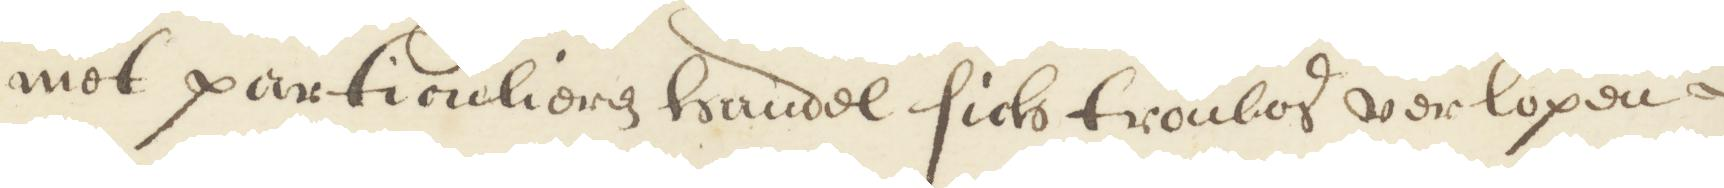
met particulieren handel sich troulos verlopen
